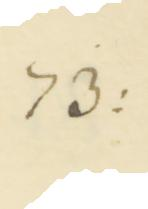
73:
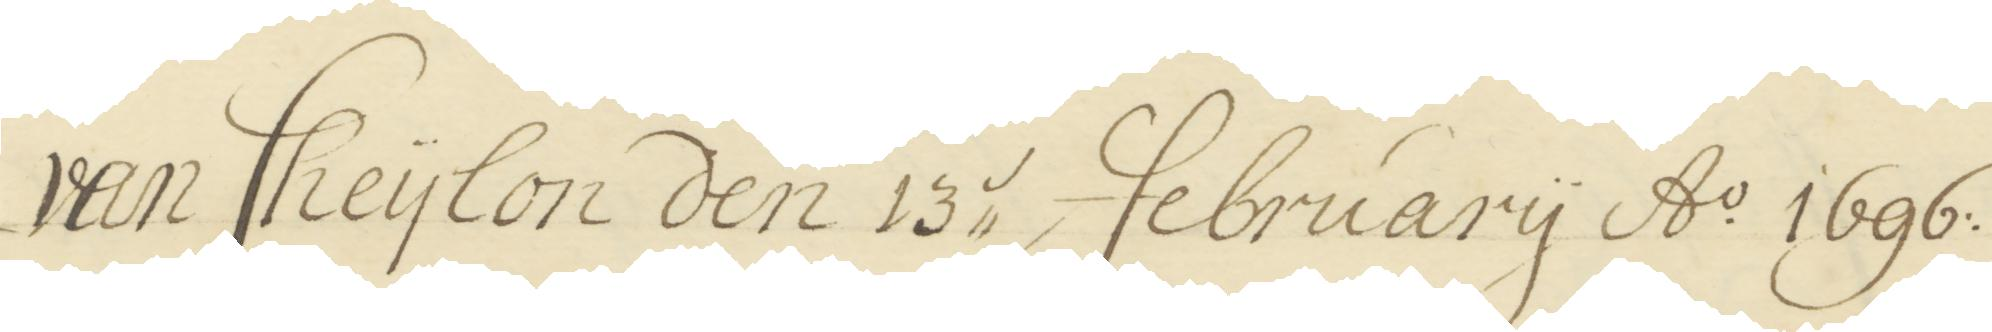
van Cheijlon den 13„e februarij A:o 1696:
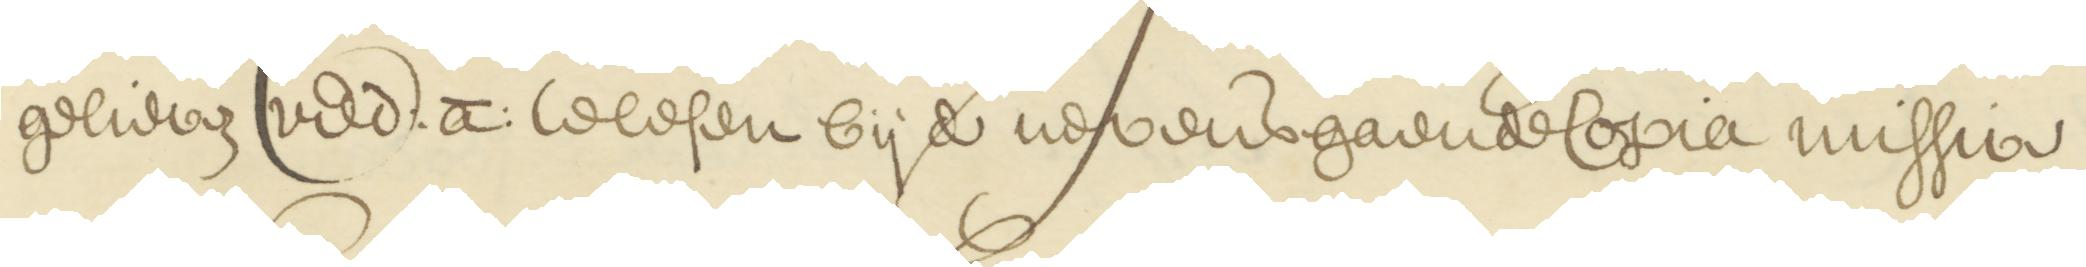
gelieven uEd: a: telesen bij de nevensgaendeCopia missive
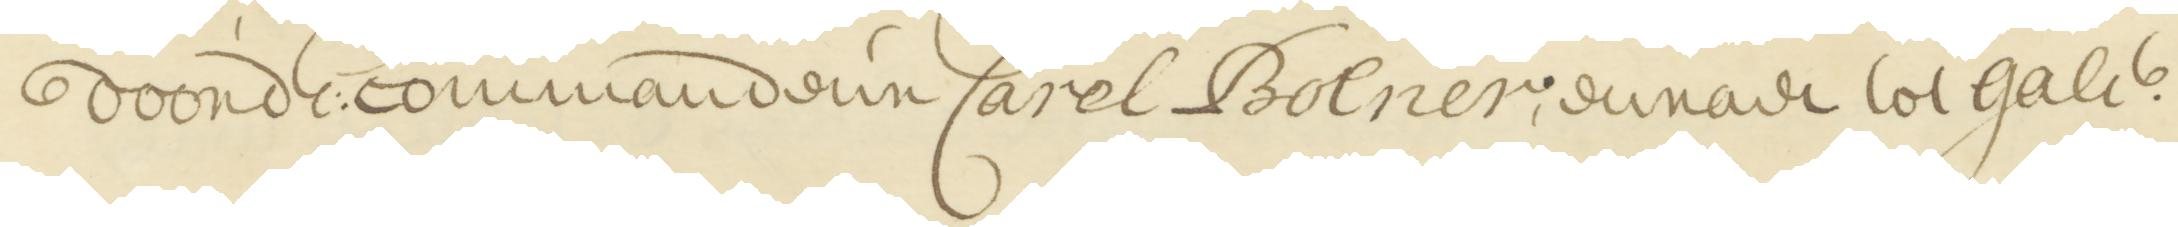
doord E: commandeur Carel Bolner, enraet tot Gale
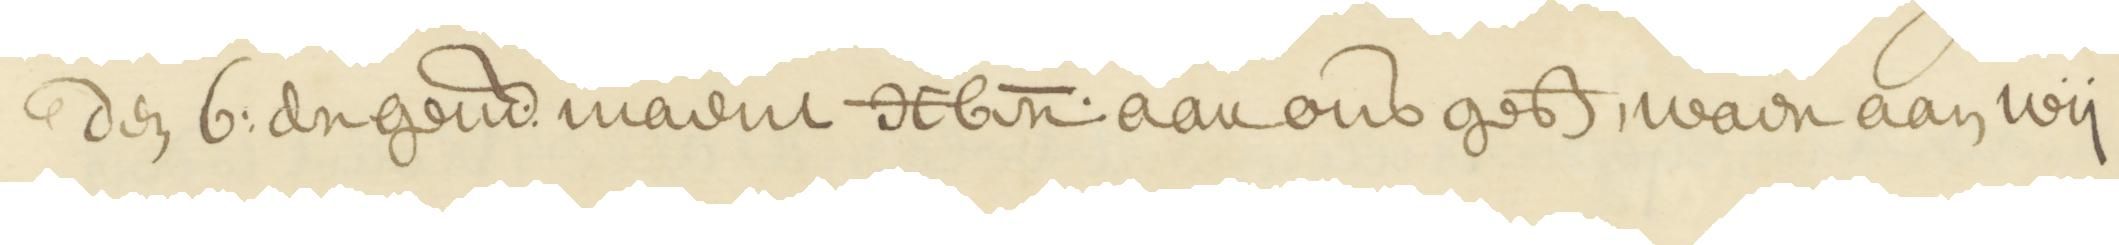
den 6: der gem: maent xber: aanons gesz, waer aan wij
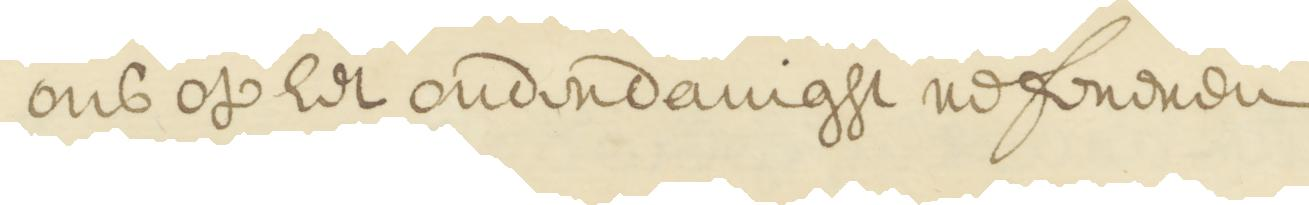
ons op het onderdanigst refereren
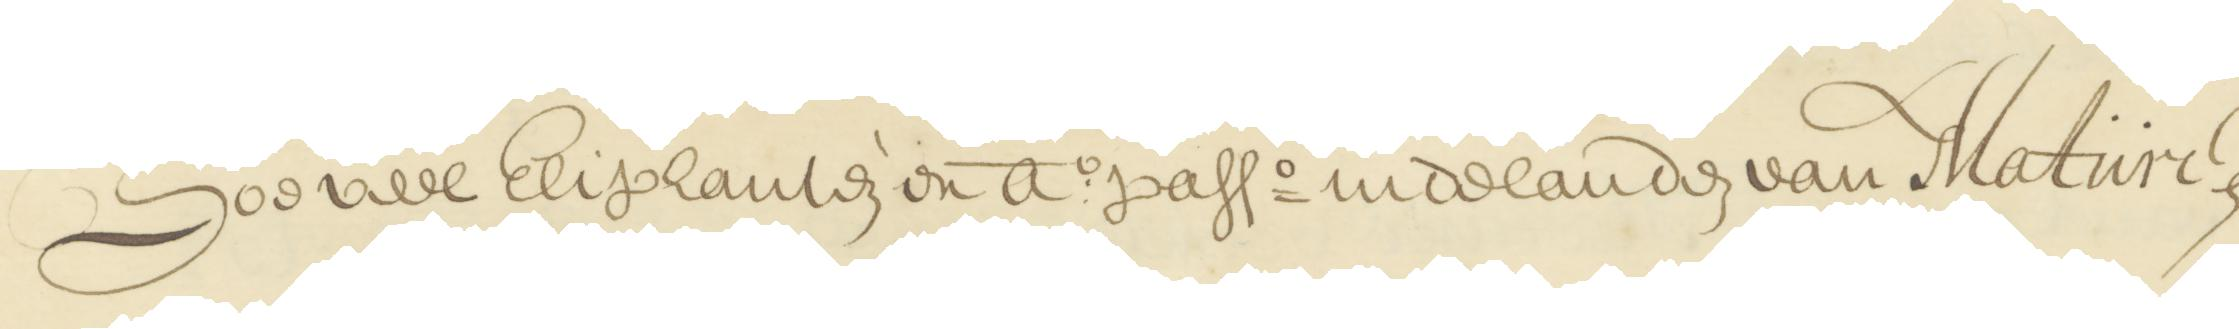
Hoeveel Eliphanten' er a:o pass=o indelanden van Mature
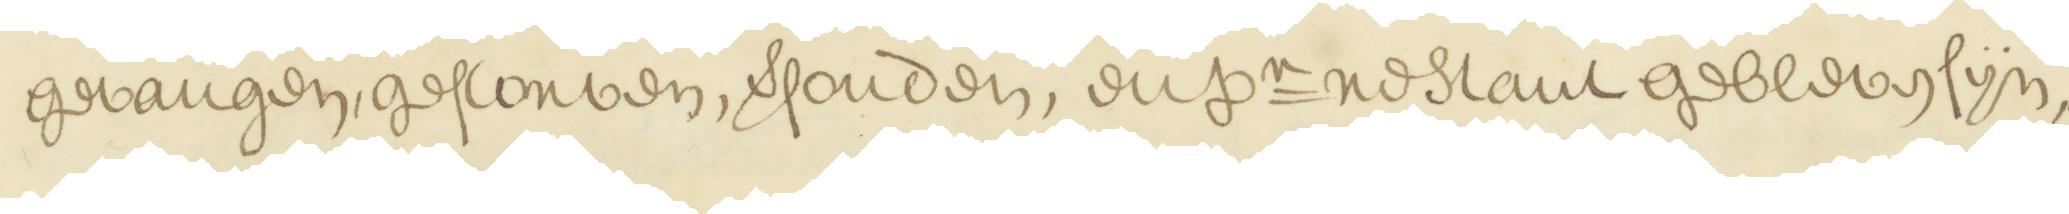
gevangen, gestorven, versonden, en p=r restant gebleven sijn,
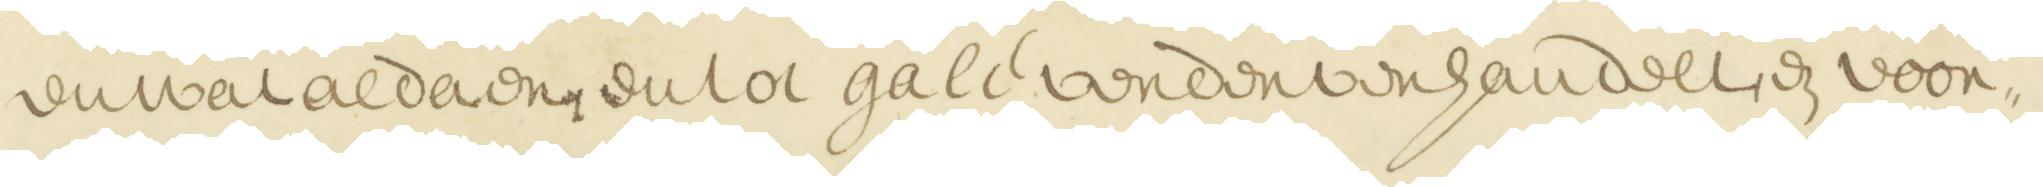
en wat aldaer, en tot gale verderverhandelt, en voor„
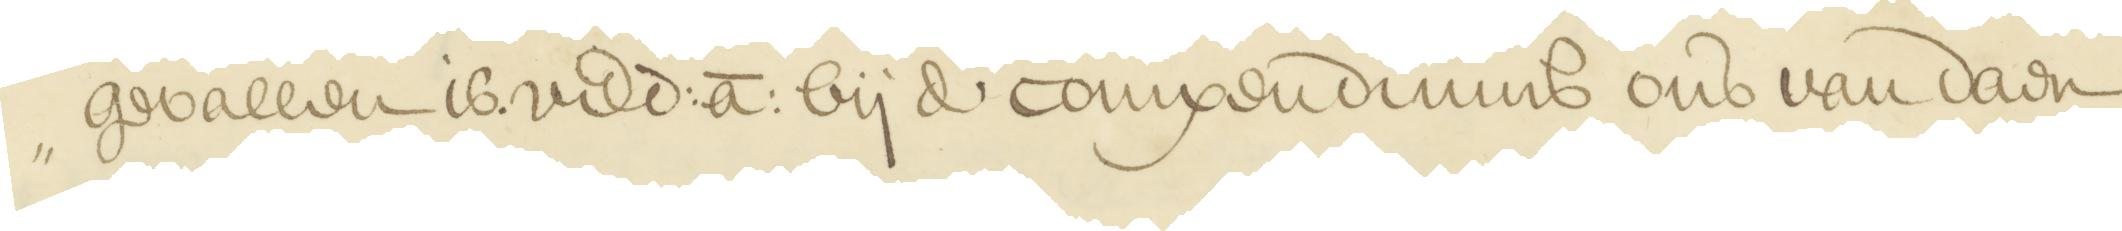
„gevallen is vEd: a: bij de compendiums ons van daer
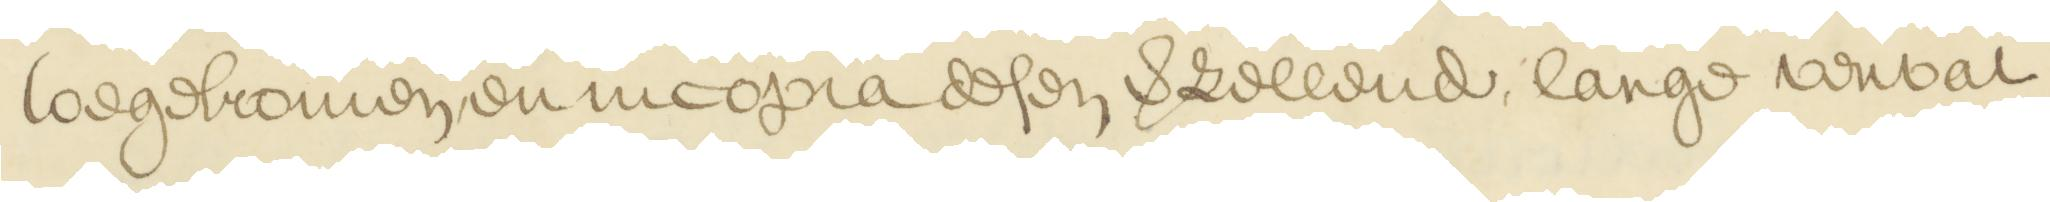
toegekomen, en incopia desen verzellende, large vervat
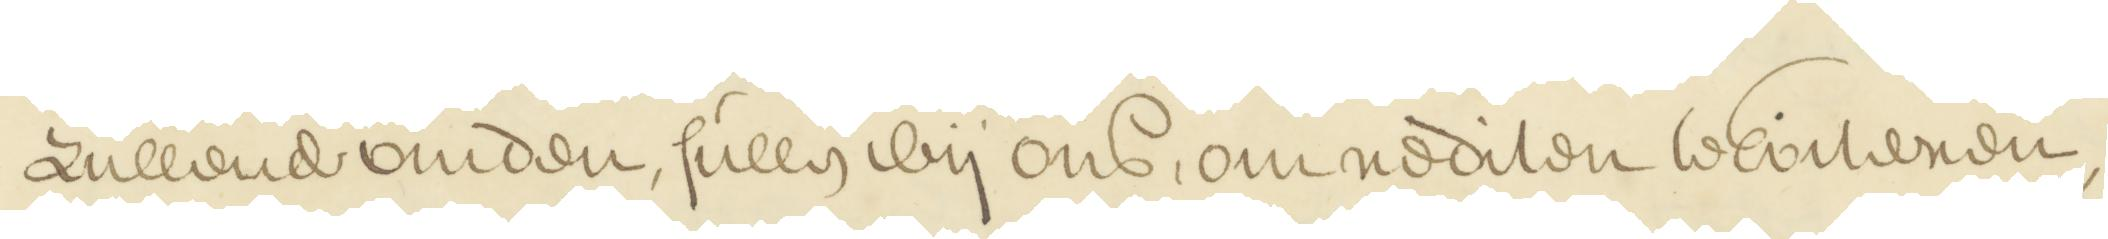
zullende vinden, sullen wij ons, om rediten te Eviteeren,
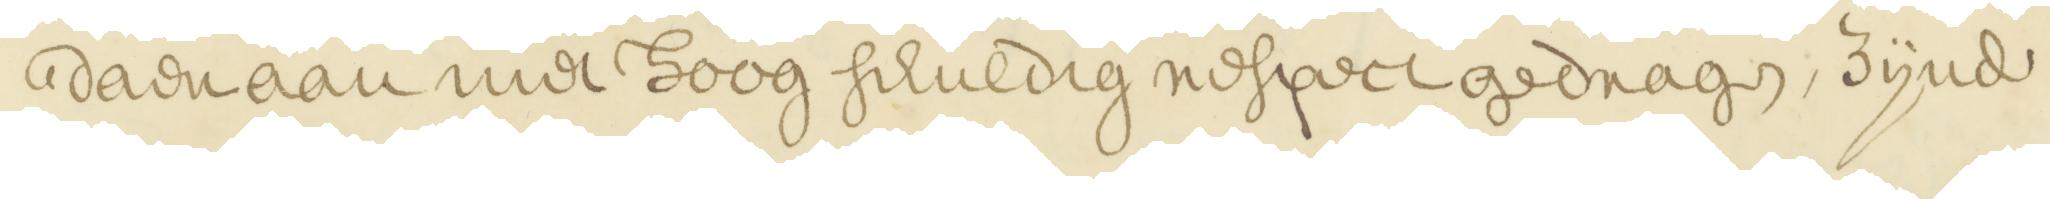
daer aan met hoog schuldig respect gedragen, zijnde
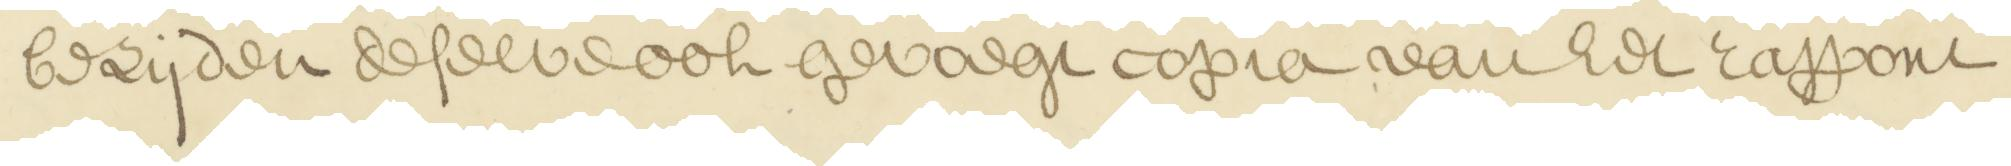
bezijden deselveook gevoegt copia van het rapport
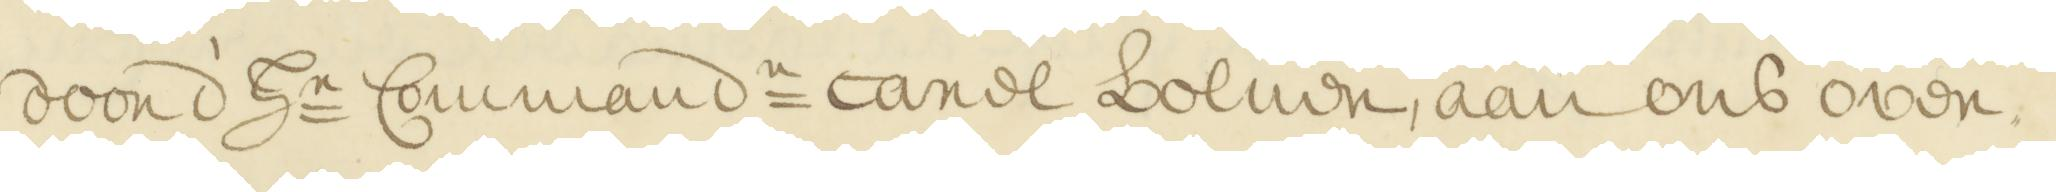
door d’ H=r Command=r carel bolner, aan ons over„
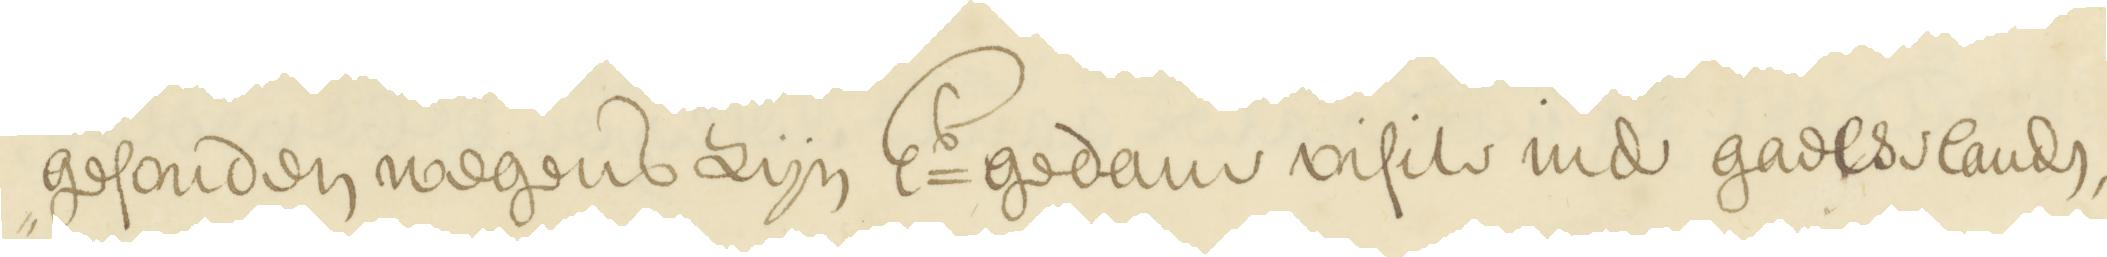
„gesonden wegens zijn E=s gedane visite inde gaelse landen,
